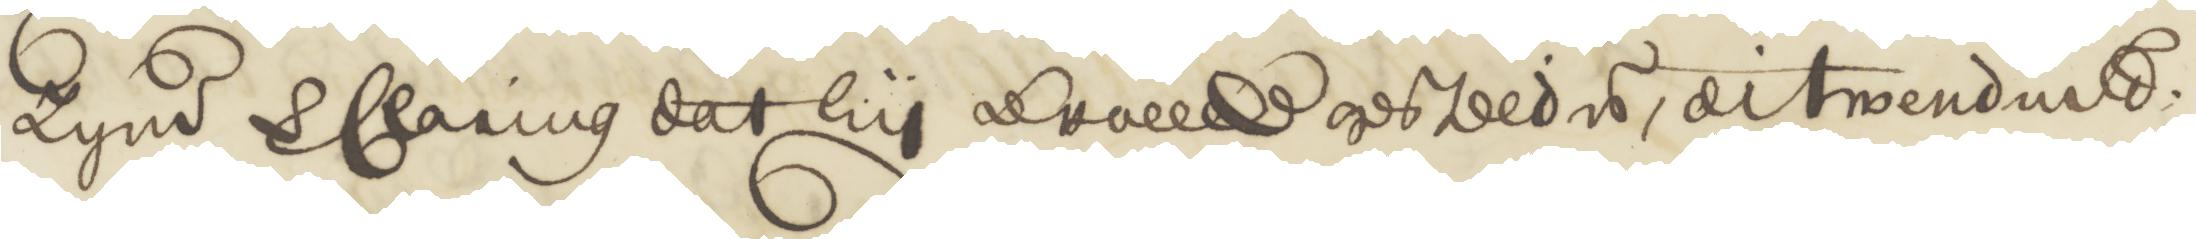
zyne verclaring dat hij terallede gesteld is, ditwerd uEd:
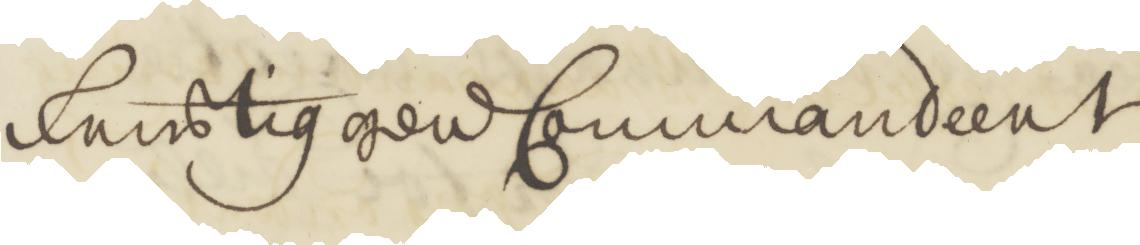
Ernstig gerecommandeert
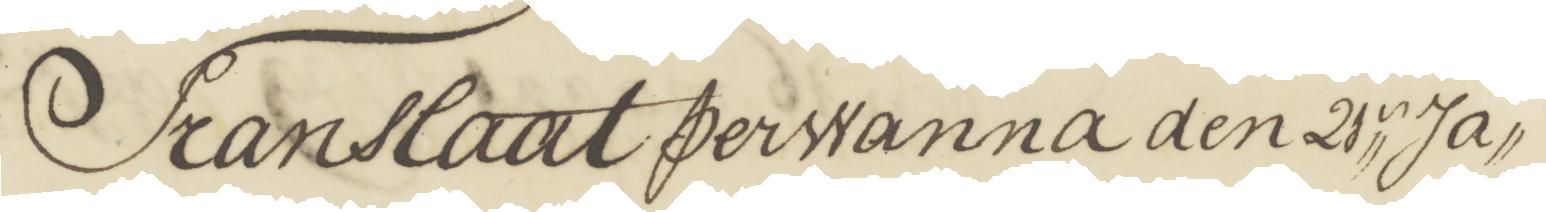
Translaat perwanna den 21„en Ja„
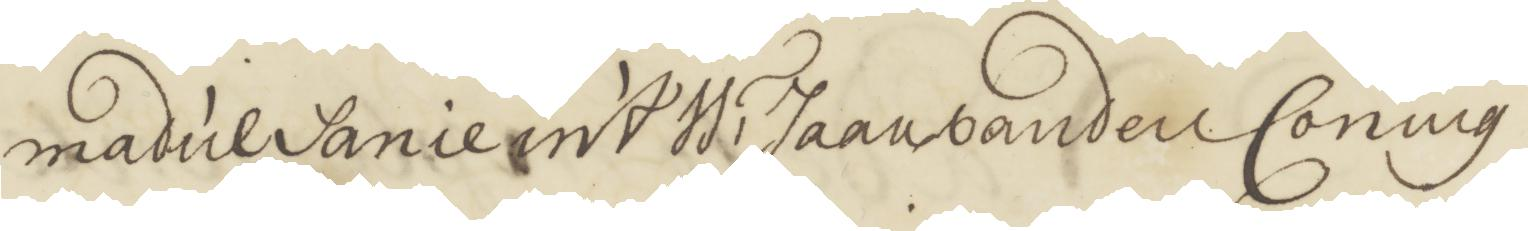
madul sanie in't 11: Jaar vanden Coning
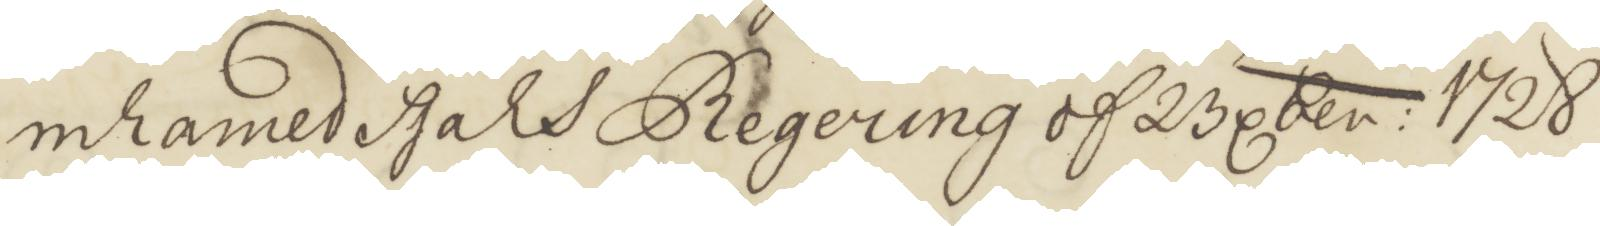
mhamed sjahs Regering of 23 xber: 1728
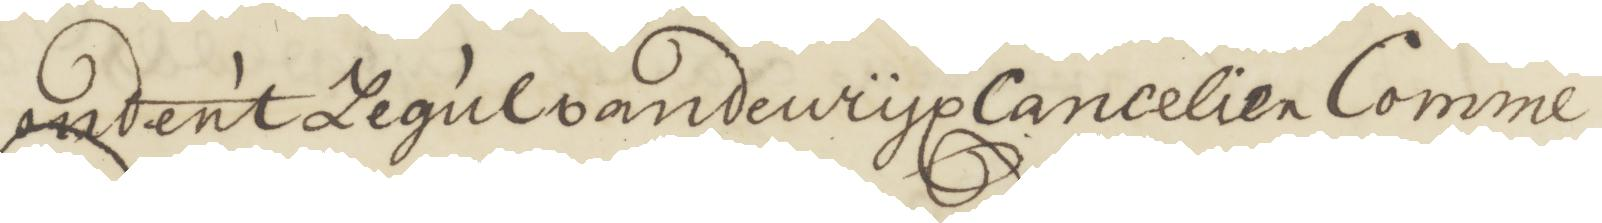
onder't Zegul vandenrijx Cancelier Comme
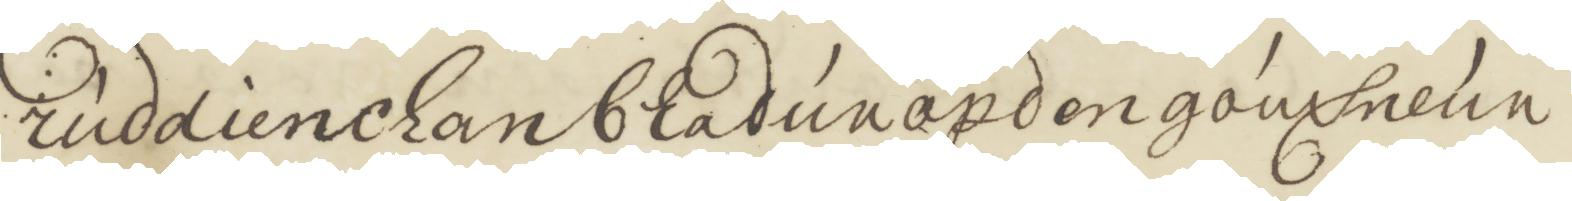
ruddienchan bhadur opden gouverneur
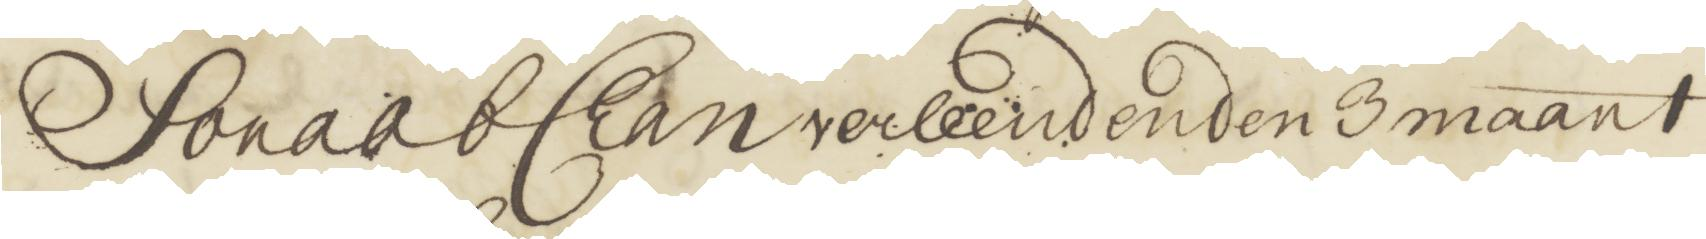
Soraaf Chan verleend enden 3 maart
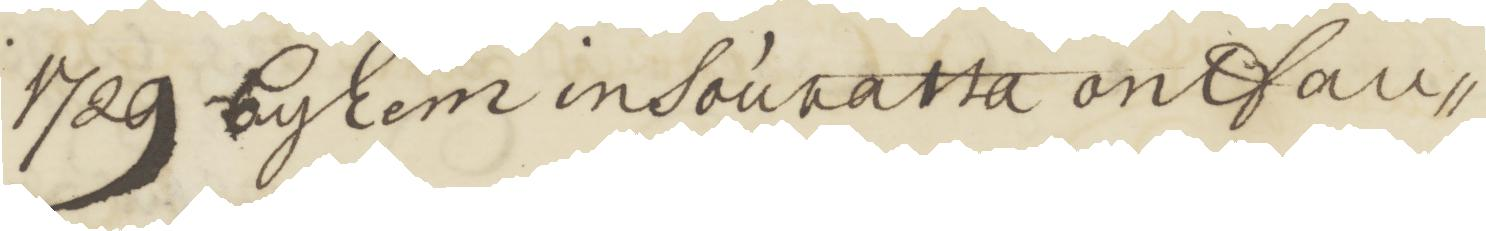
1729 byhem in souratta ontfan„
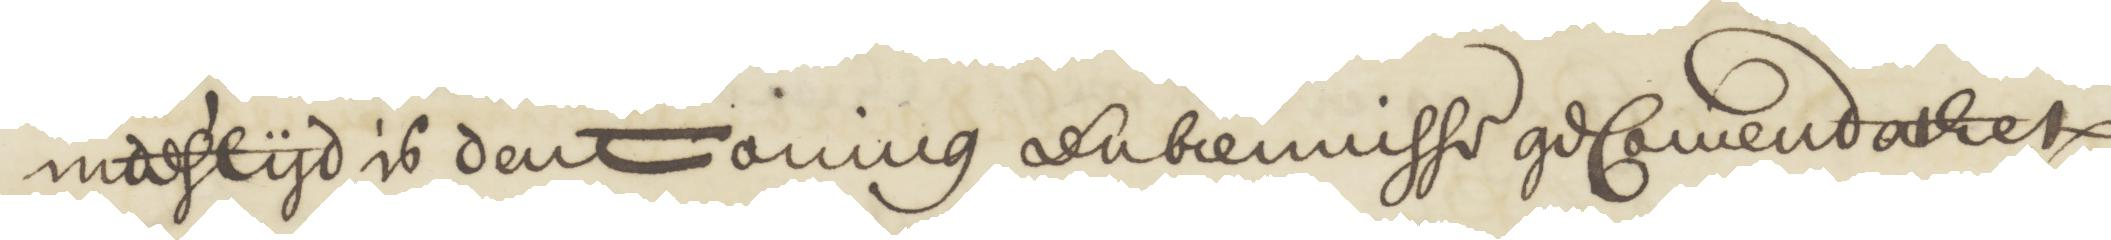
indestijd is den Coning tenkennisse gecomendathet
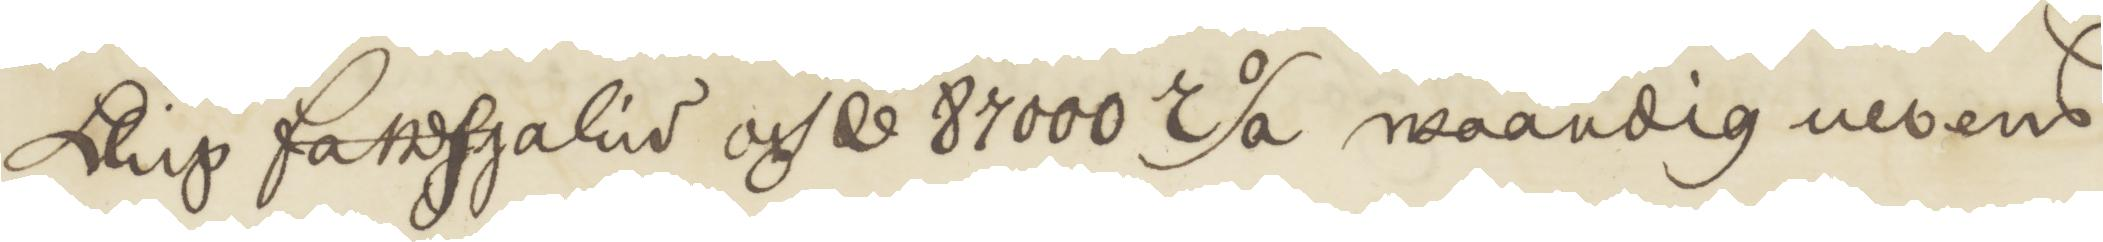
schip Fattesjahie over de 87000 r o/a waardig nevens
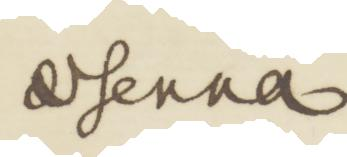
deserra
